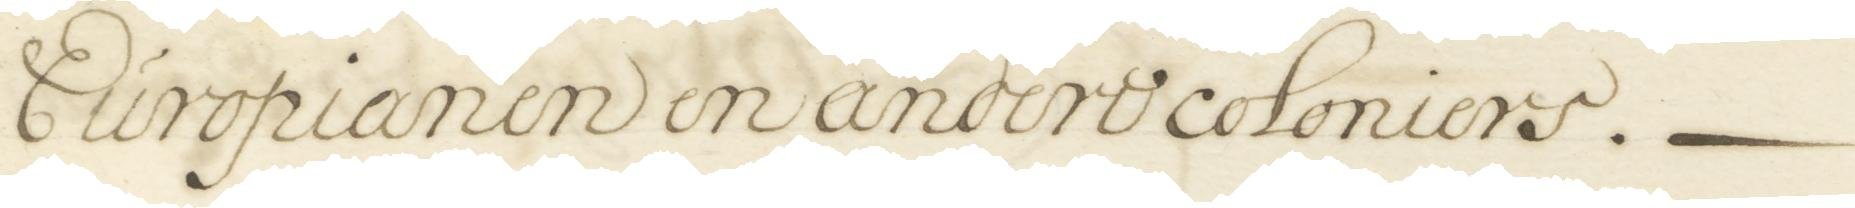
Europianen en andere coloniers.—
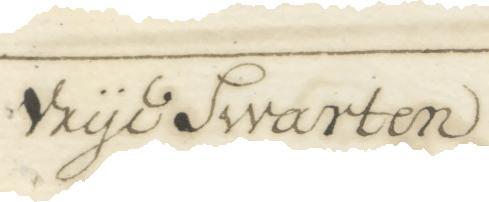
Vrije Swarten
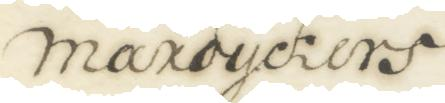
mardijckers
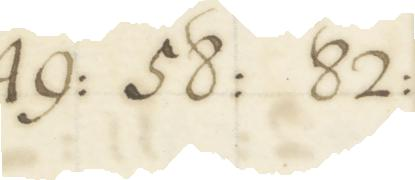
49: 58: 82:
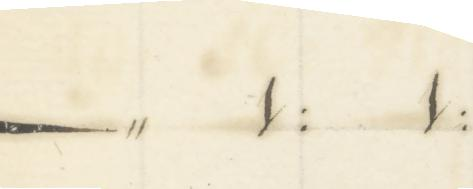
—„ 1: 1:
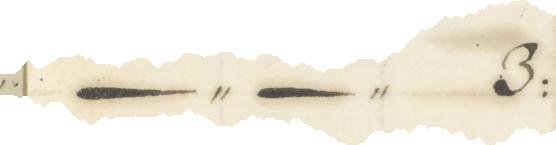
„ — „ — „ 3:
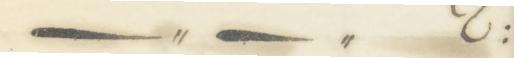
— „ —„ 2:
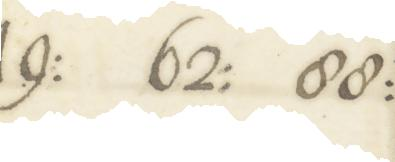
49: 62: 88:
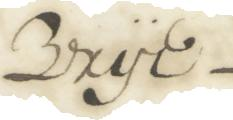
Vrije
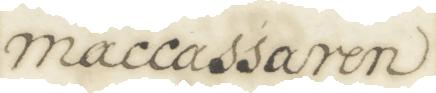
maccassaren
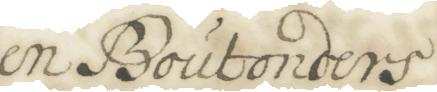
en Boutonders
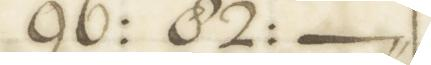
96: 82: —„
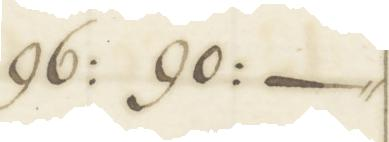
96: 90: —„
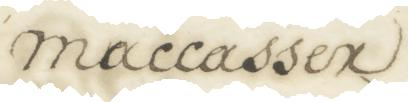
maccasser
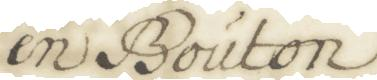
en Bouton
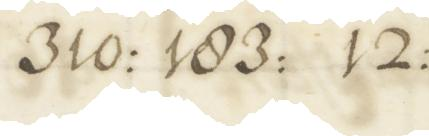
310: 183: 12:
